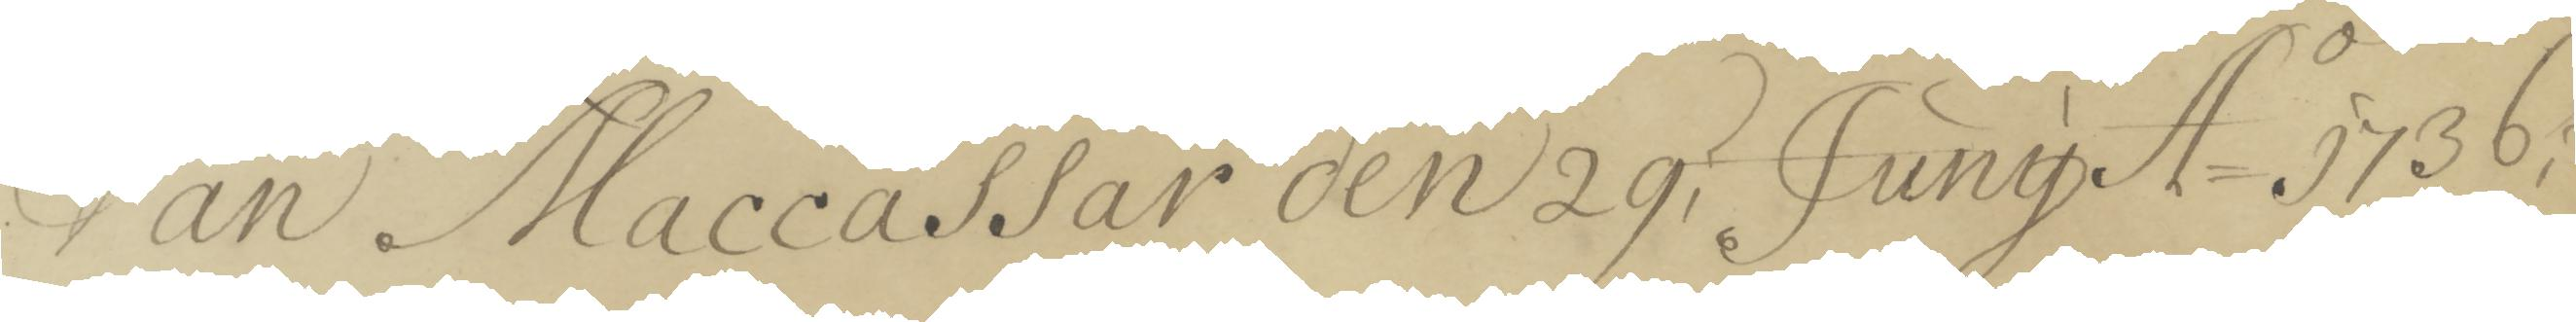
Van Maccassar den 29,' Junij A=o 1736,
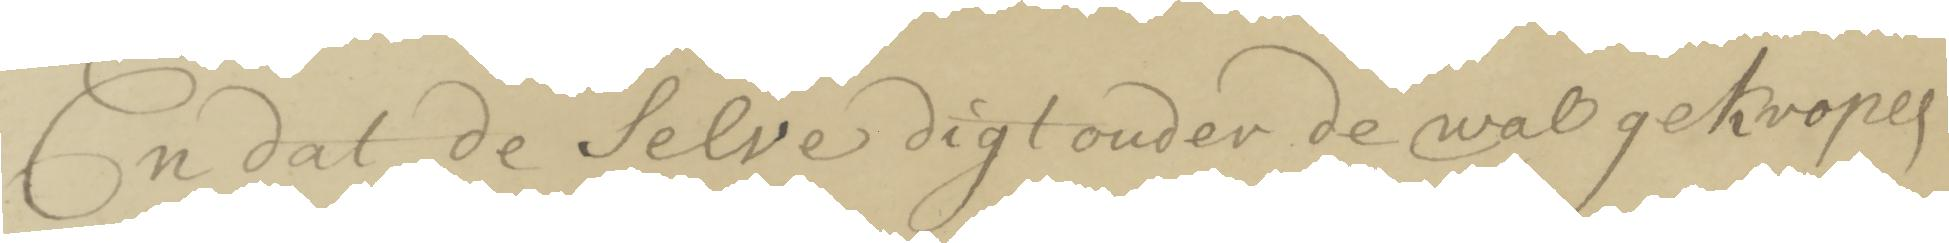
En dat de selve digt onder de wal gekropen
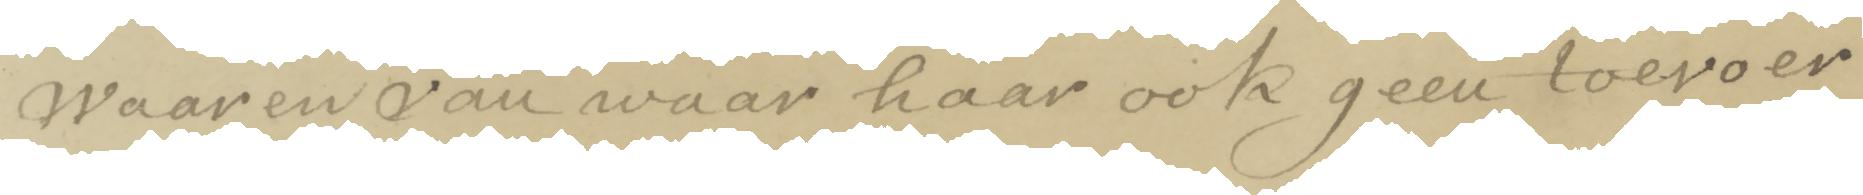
waar en van waar haar ook geen toevoer
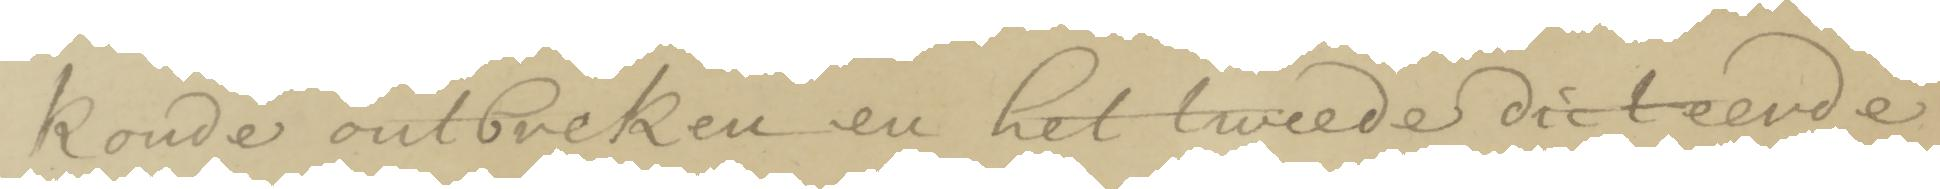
konde ontbreken en het tweede dicteerde
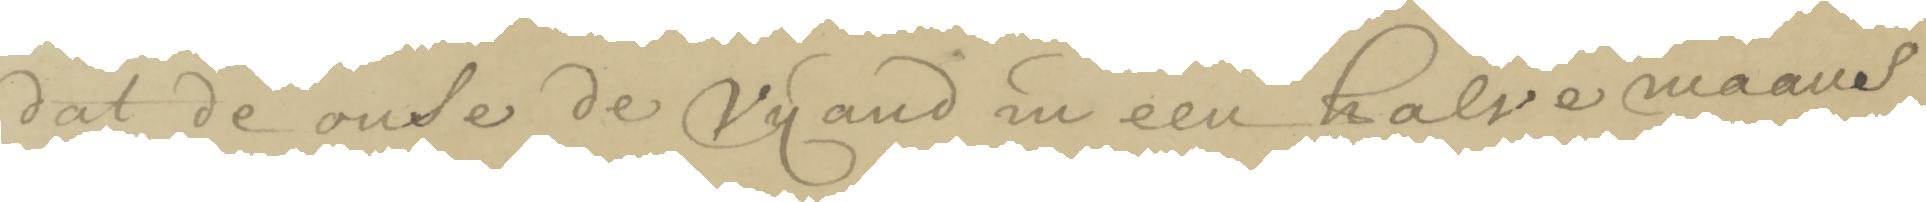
dat de onse de vijand in een halve maans
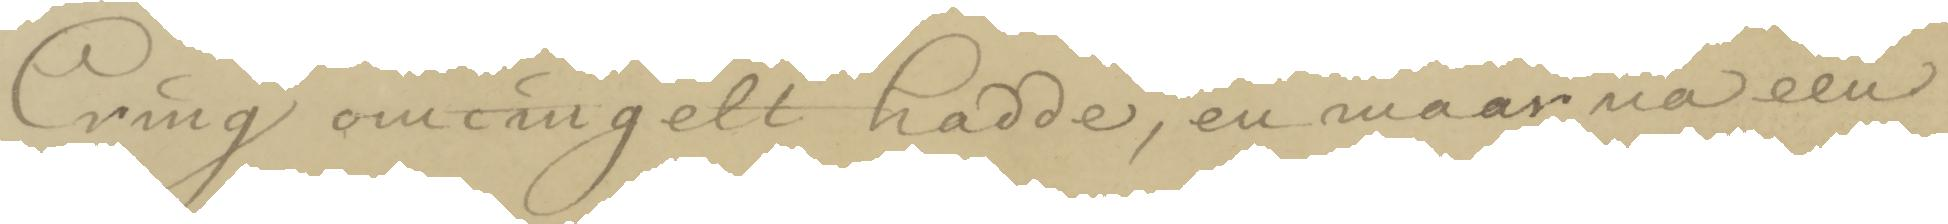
Cring omcingelt hadde, en maar na een
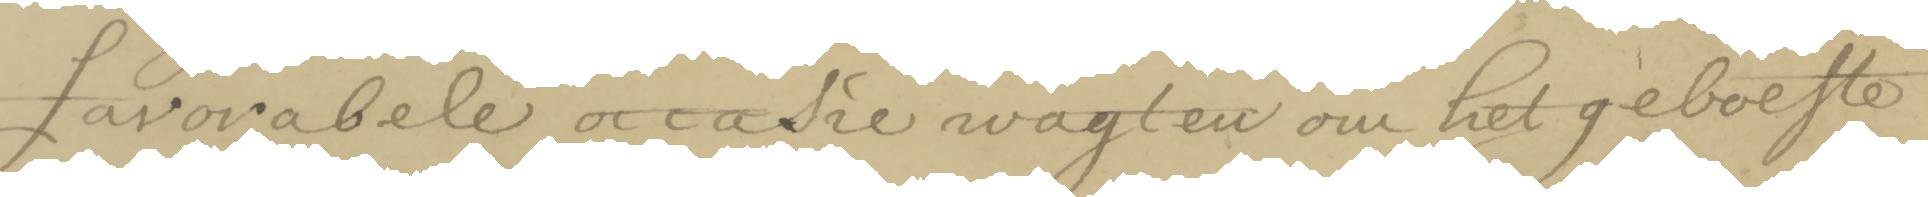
favorabele occasie wagten om het geboeste
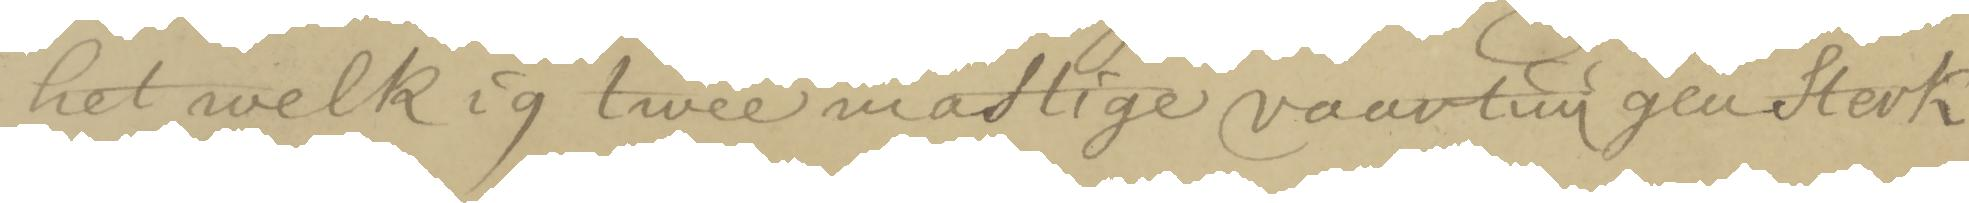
het welk in twee mastige vaartuijgen sterk
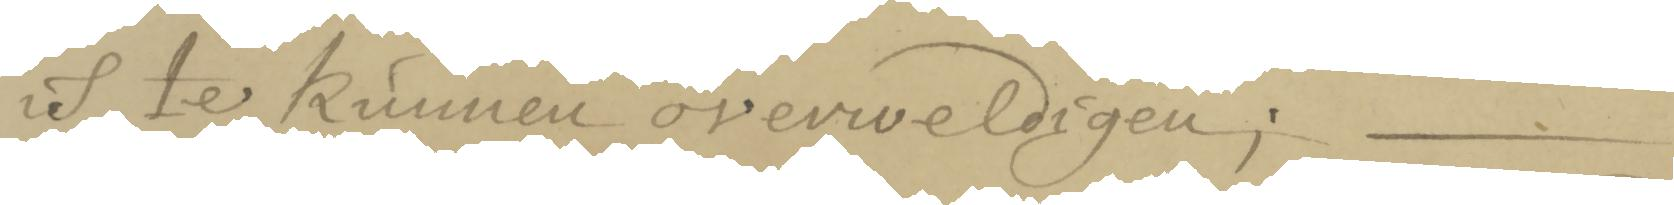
is te kunnen overweldigen; —
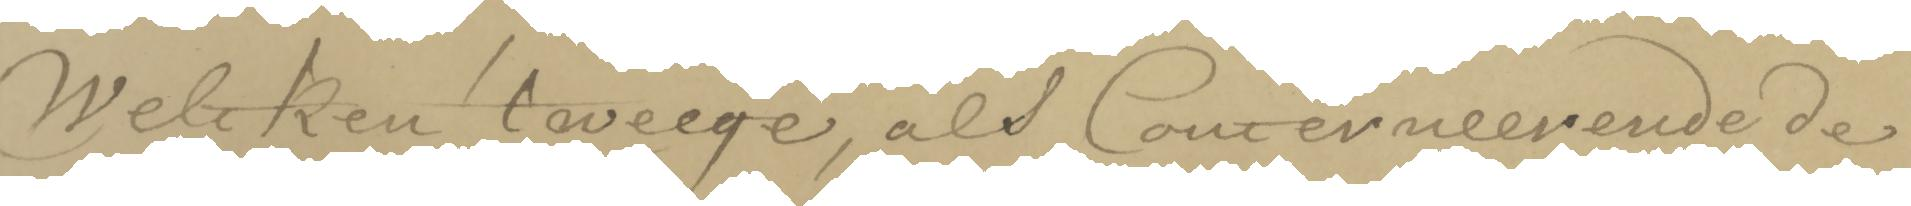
welcken 't weege, als Concerneerende de
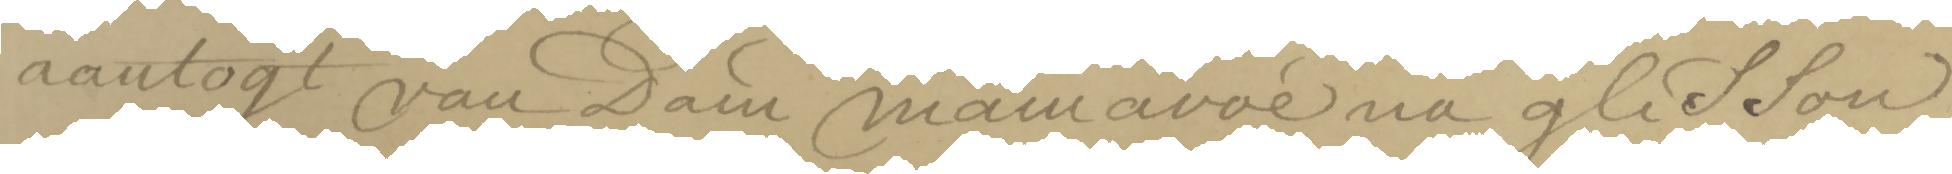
aantogt van Dain mamaroe na glisson
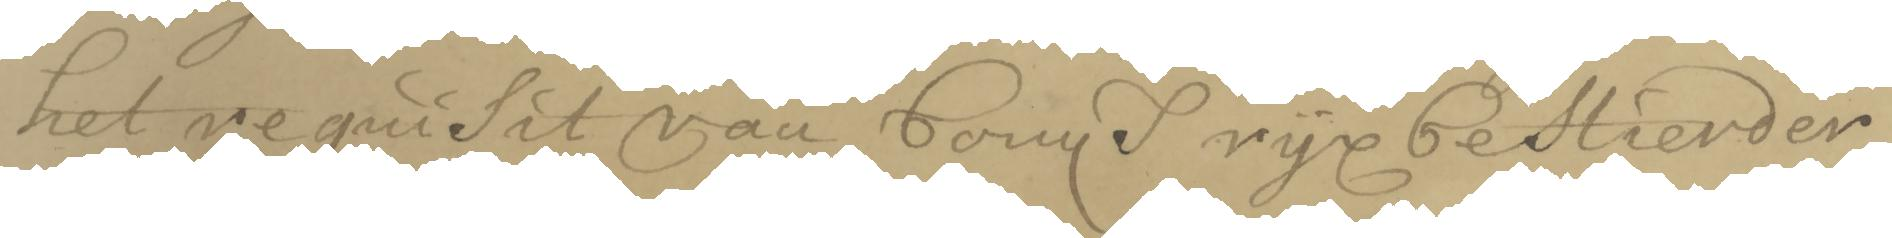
het requisit van bonys rijx bestierder
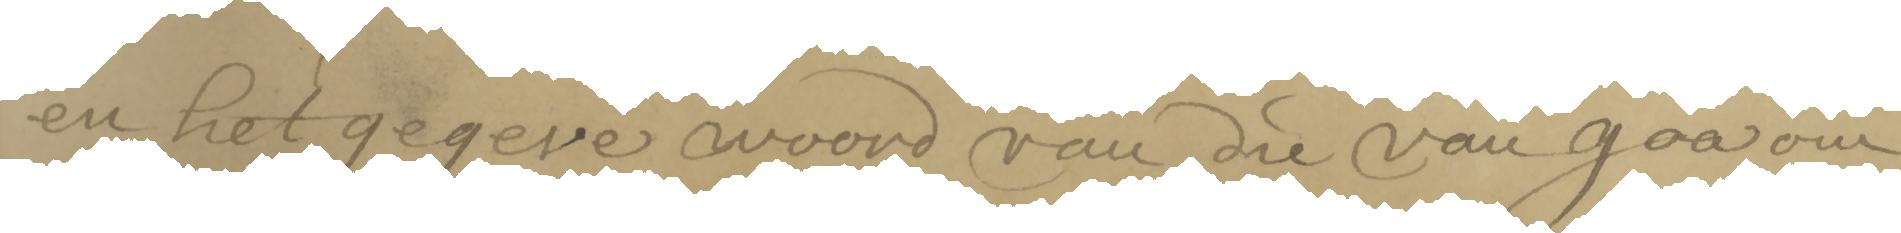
en het gegeve woord van die van goa om
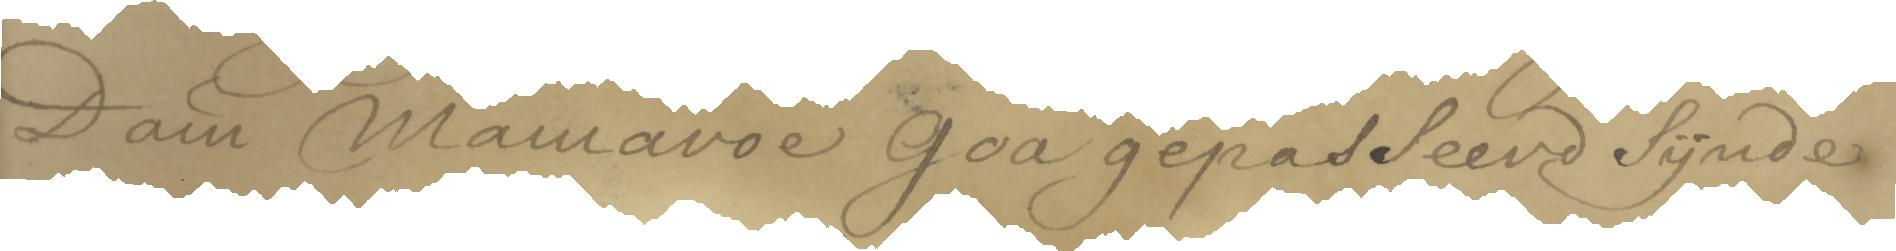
Dain mamaroe goa gepasseerd sijnde
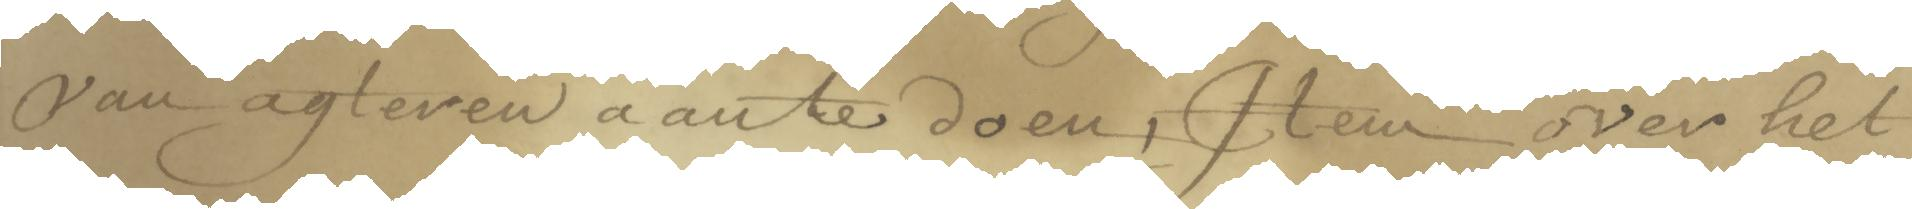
van agteren aan te doen, Jtem over het
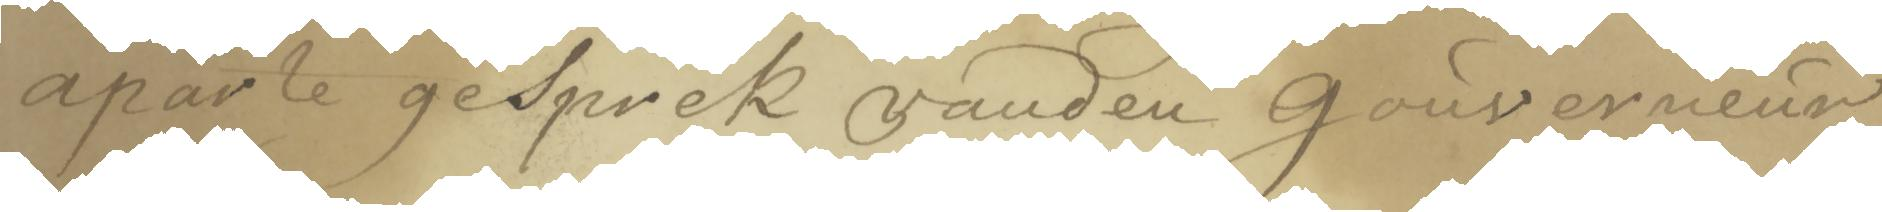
aparte gesprek vanden gouverneur
